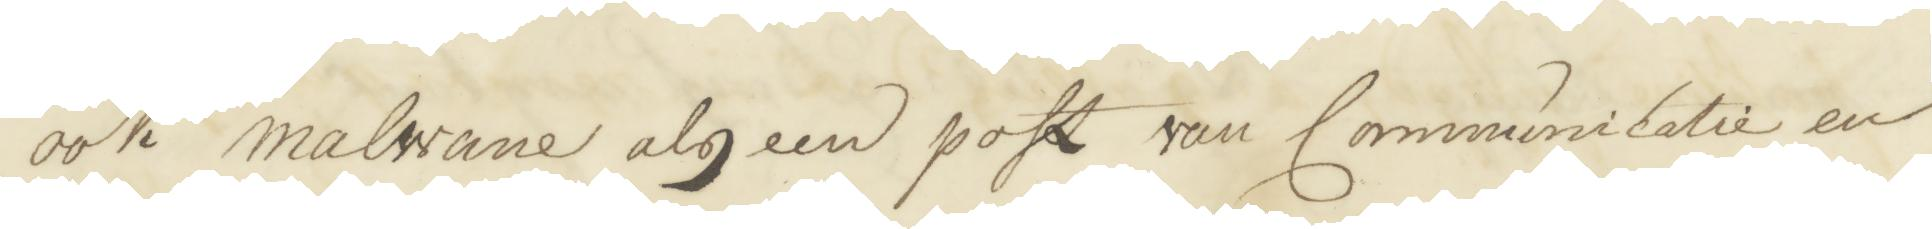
ook malwane als een post van Communicatie en
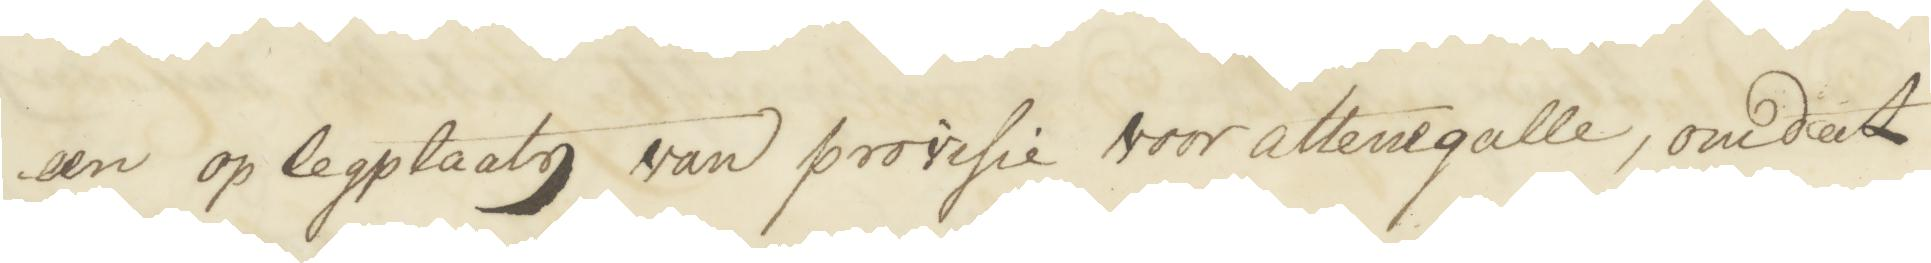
een op legplaats van provisie voor attenegalle, omdat
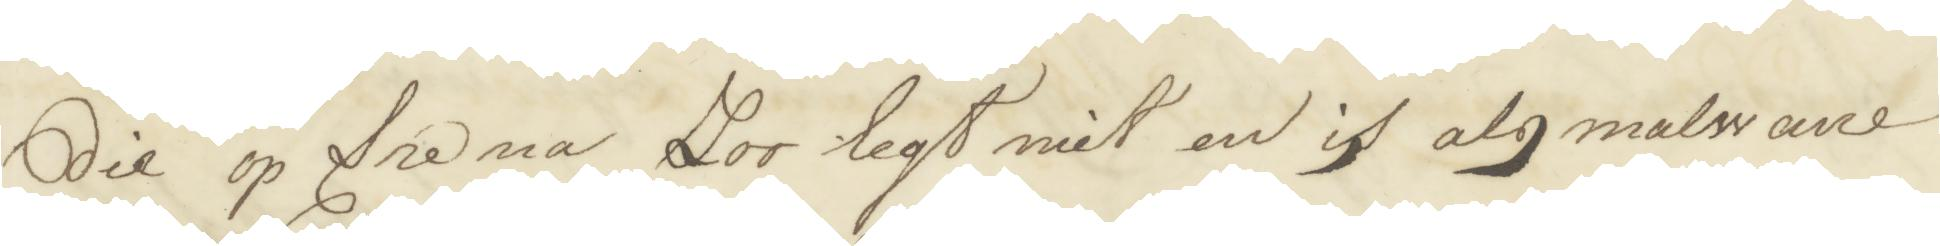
die op verre na zoo legt niet en is als malwane
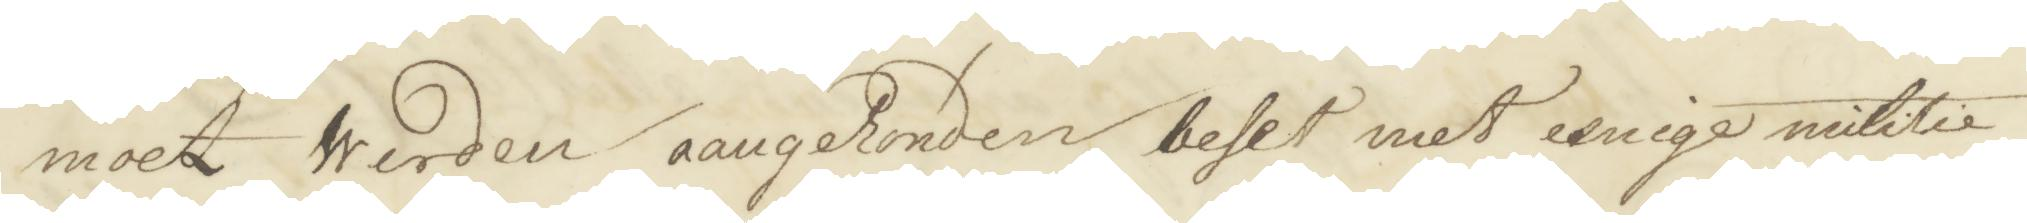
moet werden aangehouden, beset met eenige militie
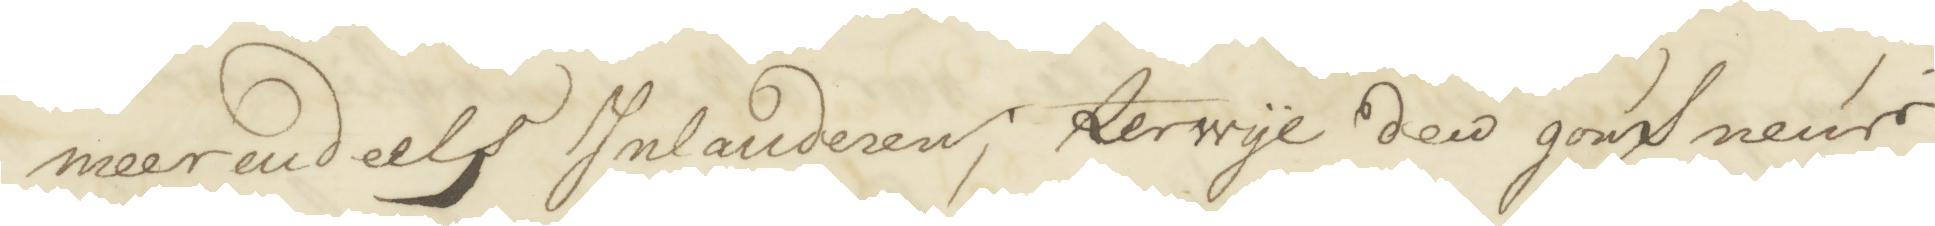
meer en deels Jnlandesen, terwijl den gouverneur
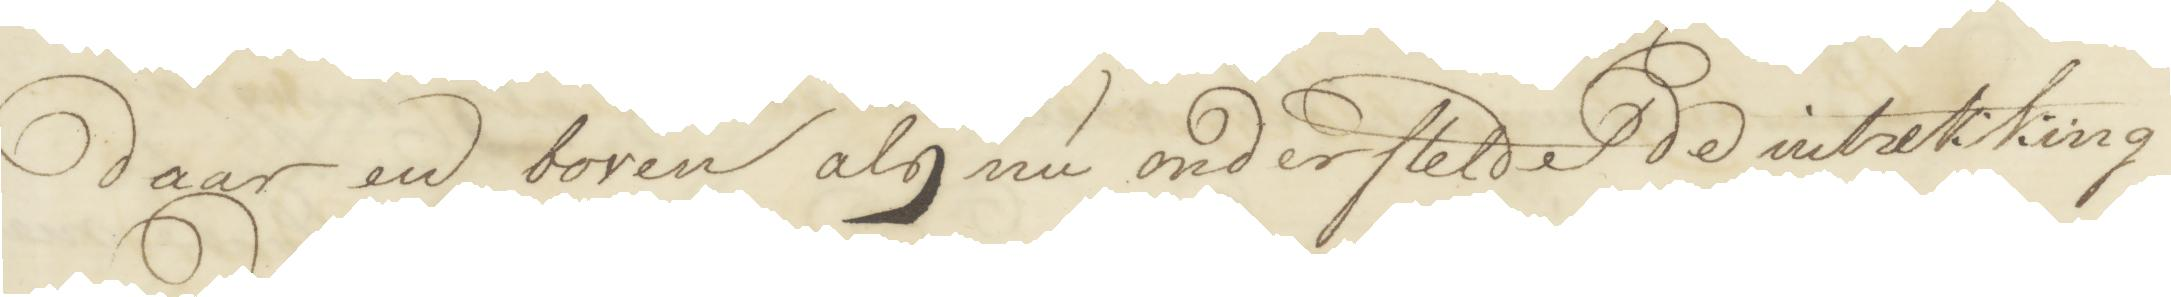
daar en boven als nu onderstelde de intrekking
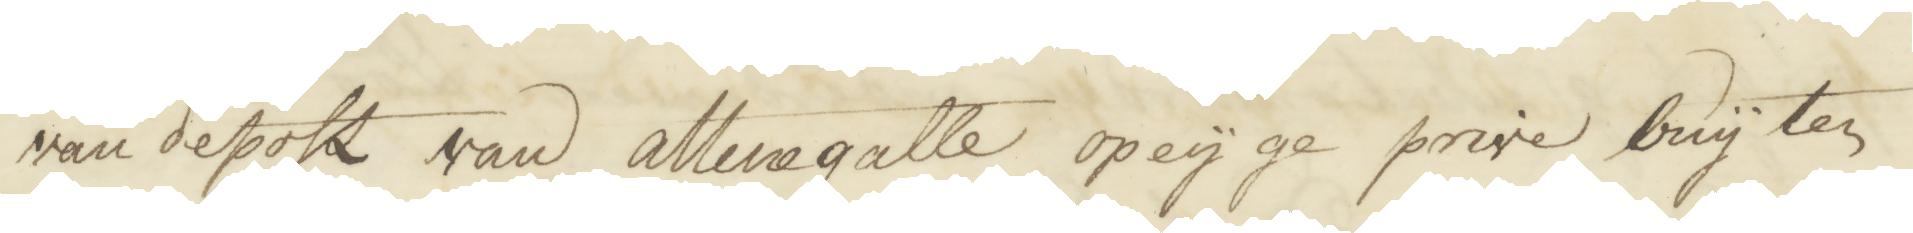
van de post van attengalle op eijge prive buijten
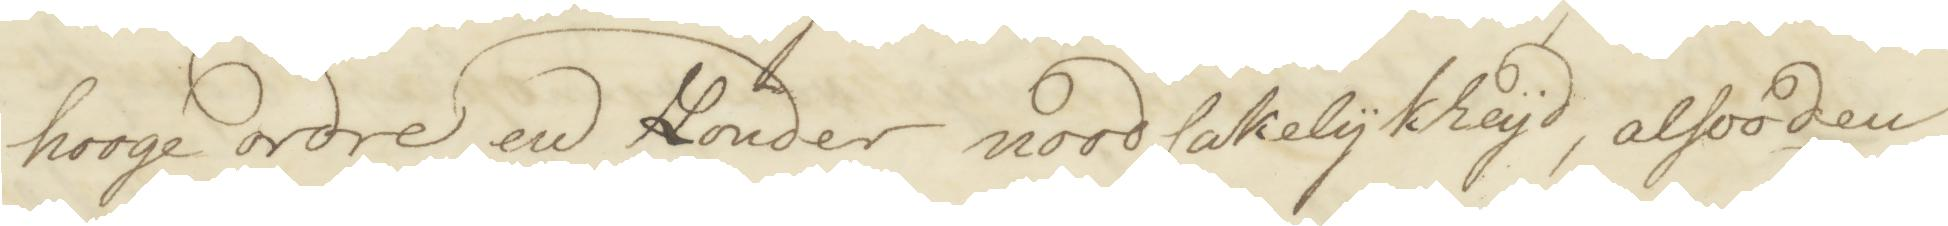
hooge ordre en zouder noodsakelijkheijd, alsoo den
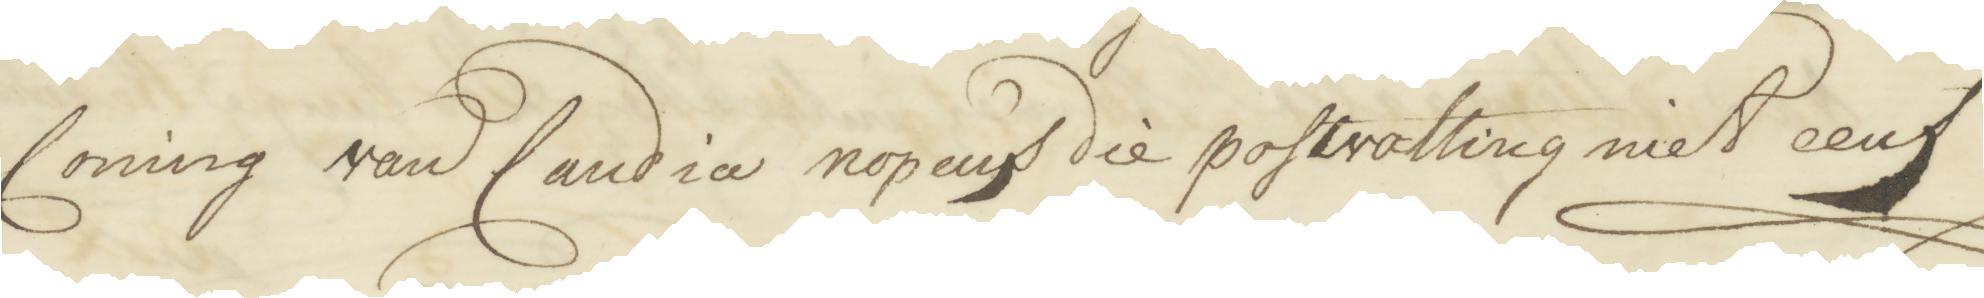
Coning van Candia nopens die postvatting niet eens
